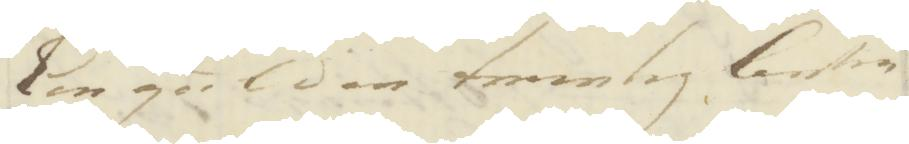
Een gulden twintig Cent
